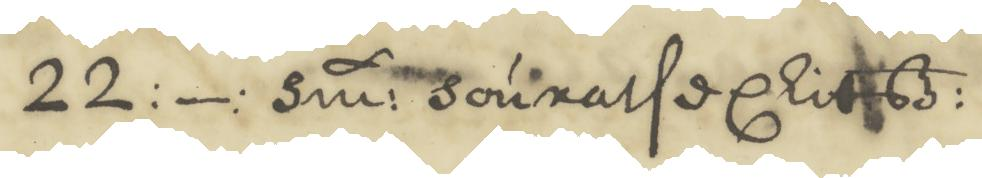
22: —: sm: souratse Chits:
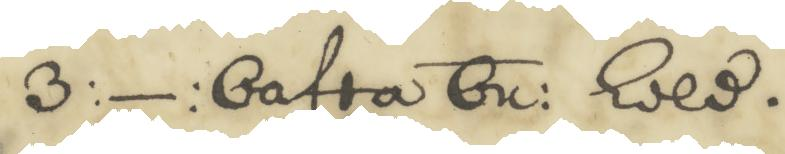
3: —: bafta br: hele.
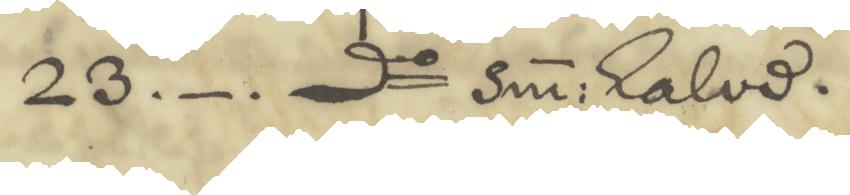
23. —. d=o sm: halve.
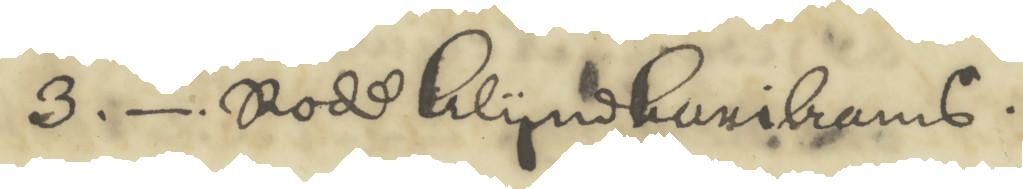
3. —. Rode klijne karikams.
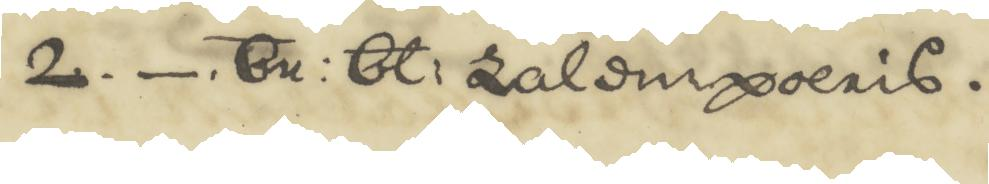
2. —. br: bl: zalempoeris.
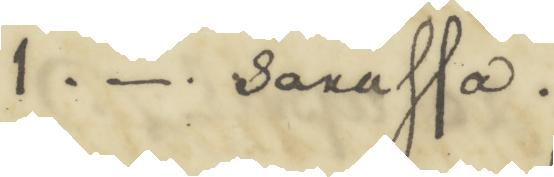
1. —. sarassa.
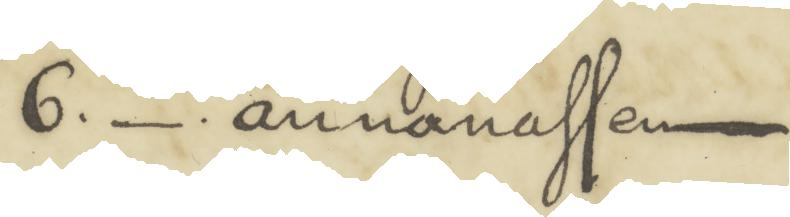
6. —. annanassen
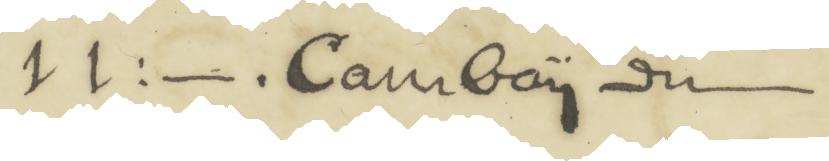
11: —. Camboij en
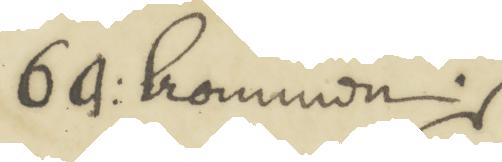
64: kommen.
